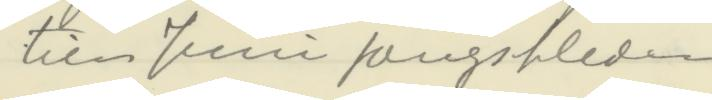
tien Juni jongstleden
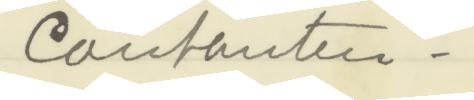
Contanten -
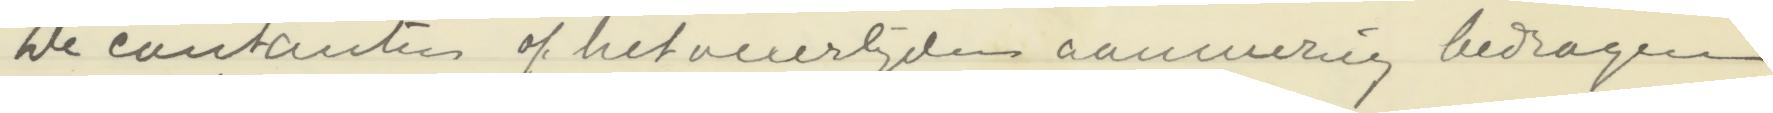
De contanten op het overlyden aanwezig bedragen
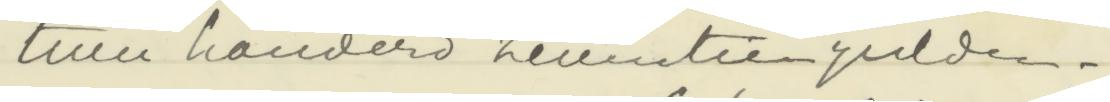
twee honderd zeventien gulden.
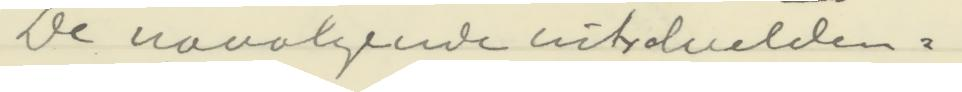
De navolgende uitschulden :
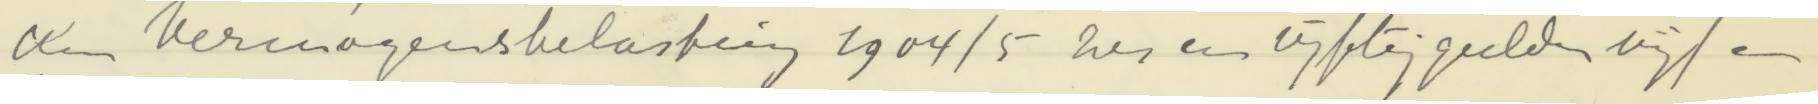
de vermogensbelasting 1904/5 zes en vijftig gulden vijf en
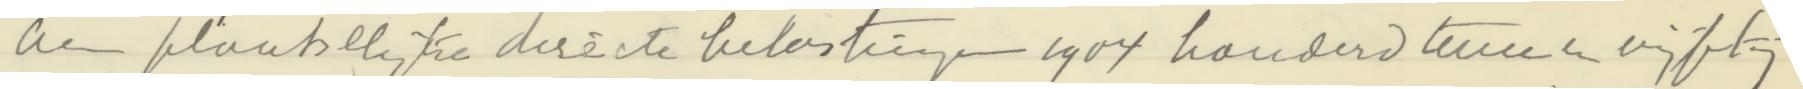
aan plaatselijke directe belastingen 1907 honderd twee en vijftig
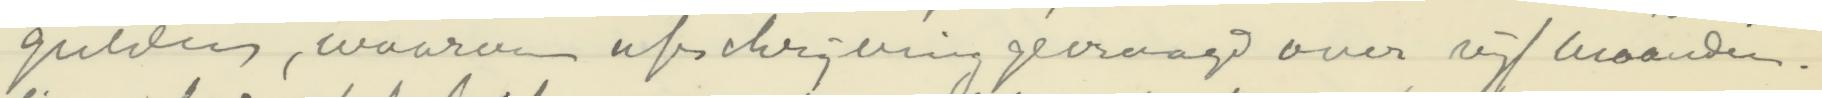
gulden, waarvan afschrijving gevraagd over vijf maanden.
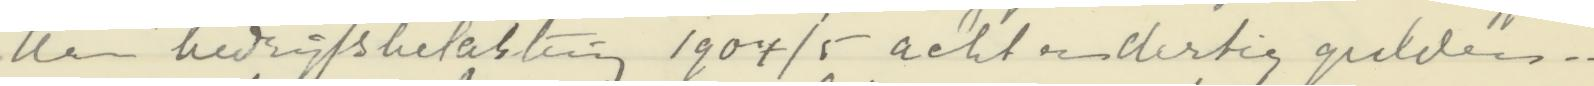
den bedrijfsbelasting 1904/5 acht en dertig gulden.
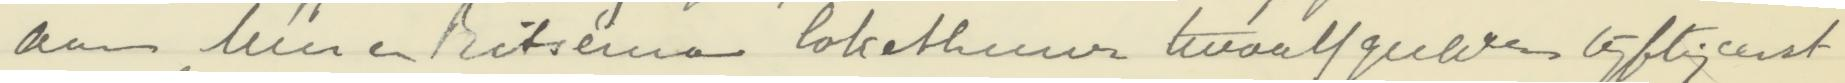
aan heeren Ritsema lokethuur twaalf gulden vijftig cent
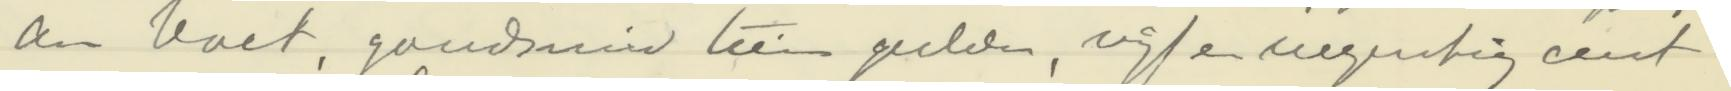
aan Voet, goudsmid tien gulden vijf en negentig cent.
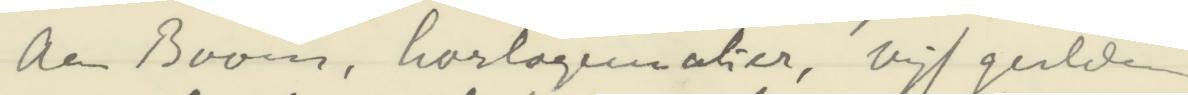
Aen Boom, horlogemaker, vijf gulden
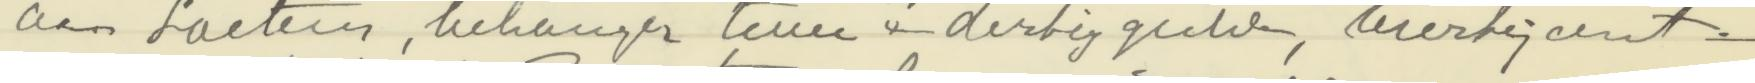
Aan Sactem, behanger, twee en dertig gulden, veertig cent
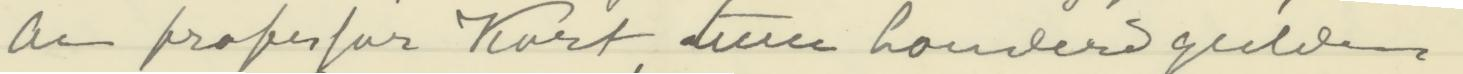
Aan professor Kort, twee honderd gulde
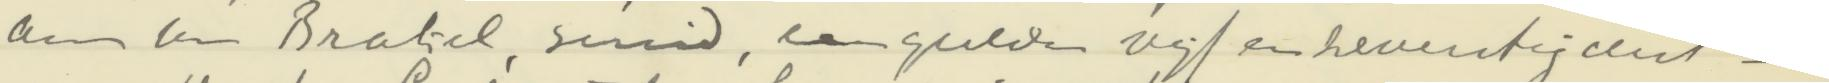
Aan Brakel, smid, een gulden vijf en zeventig cent—
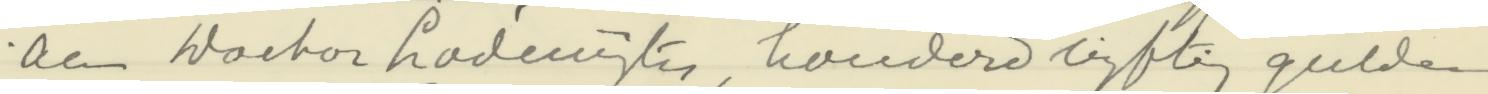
Aan Doctor Lodewijk, honderd vijftig gulden
